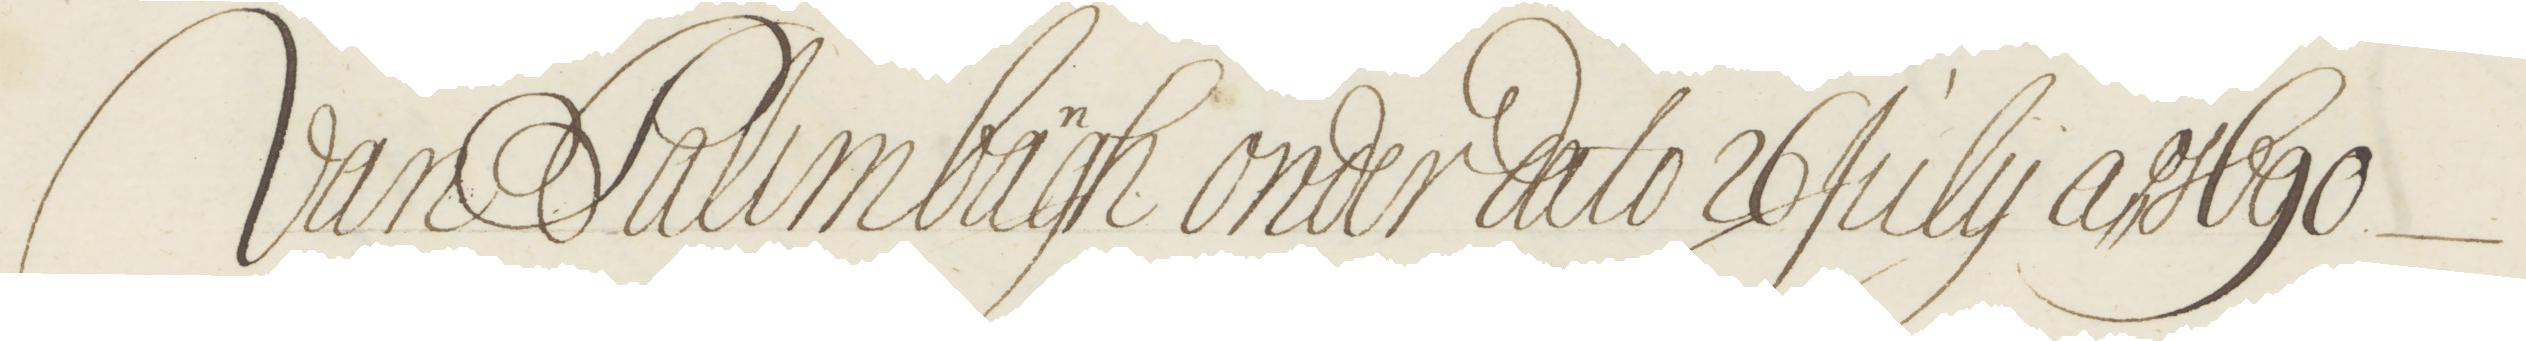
Van Palimbangh onder dato 26 July a„o 1690 —
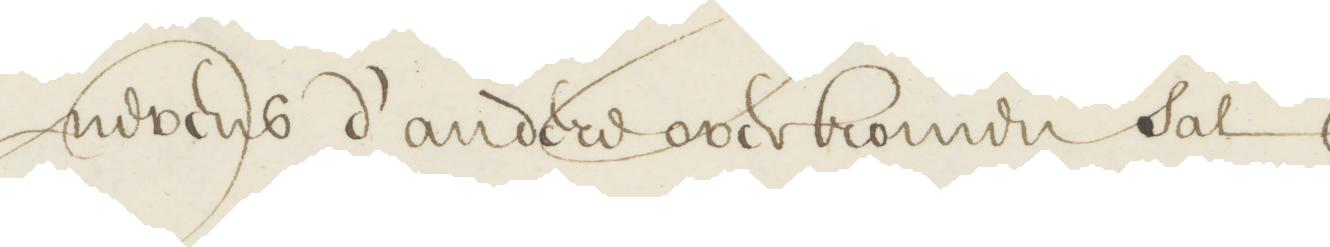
nevens d’ andere overkomen sal
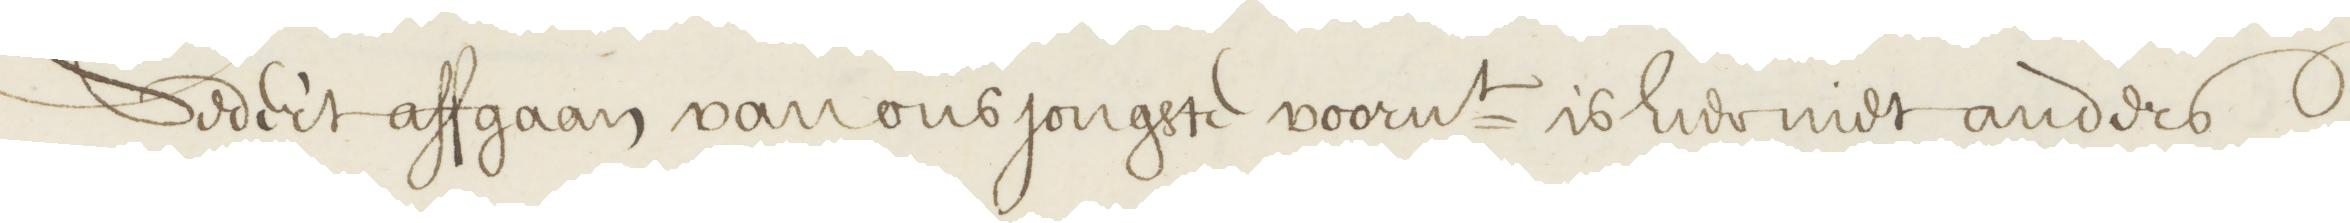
Seder't affgaan van ons jongste voorn=t is hier niet anders
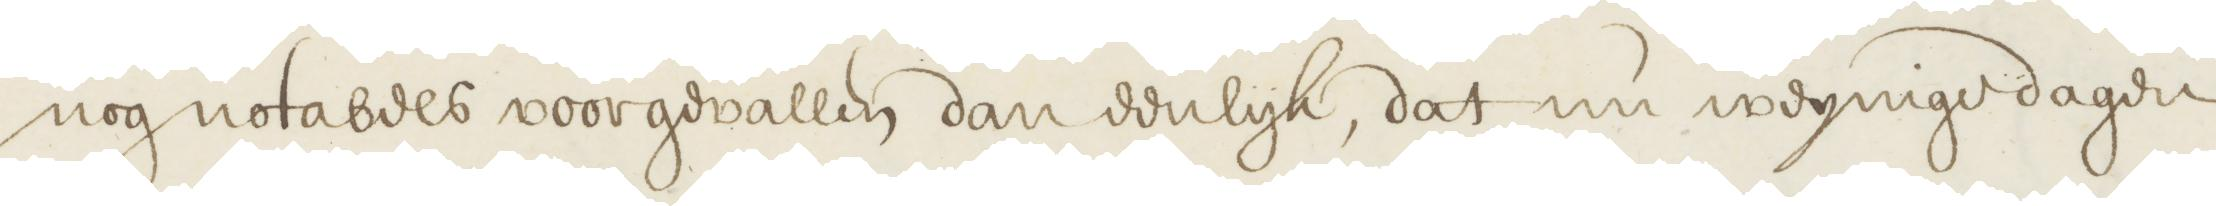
nog notabels voorgevallen dan eenlijk, dat nu weijnige dagen
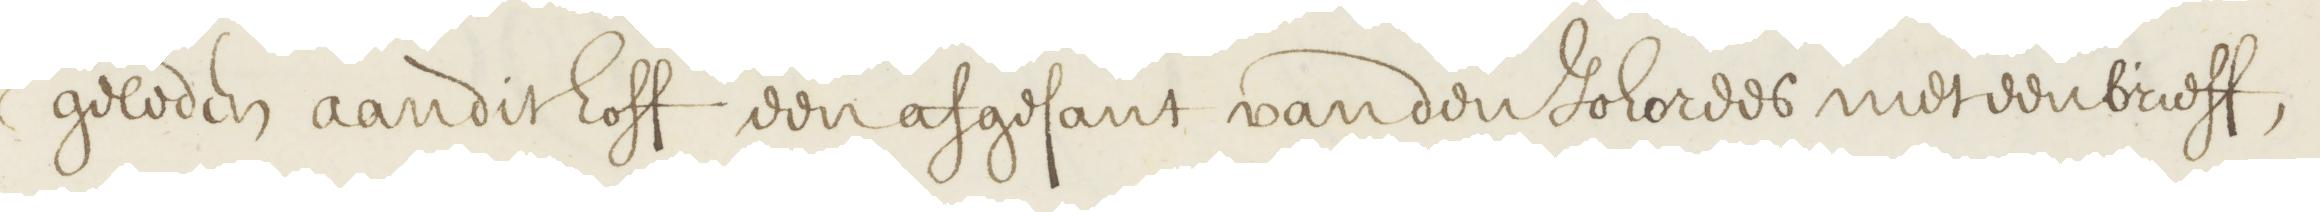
geleden aan dit hoff een afgesant van den Iohorees met een brieff,
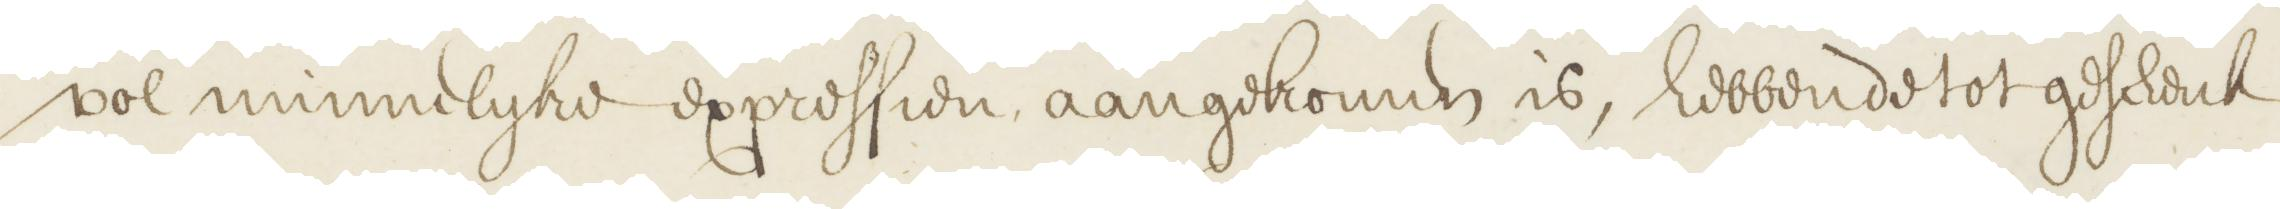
vol minnelijke expressien aangekomen is, hebbende tot geschenk
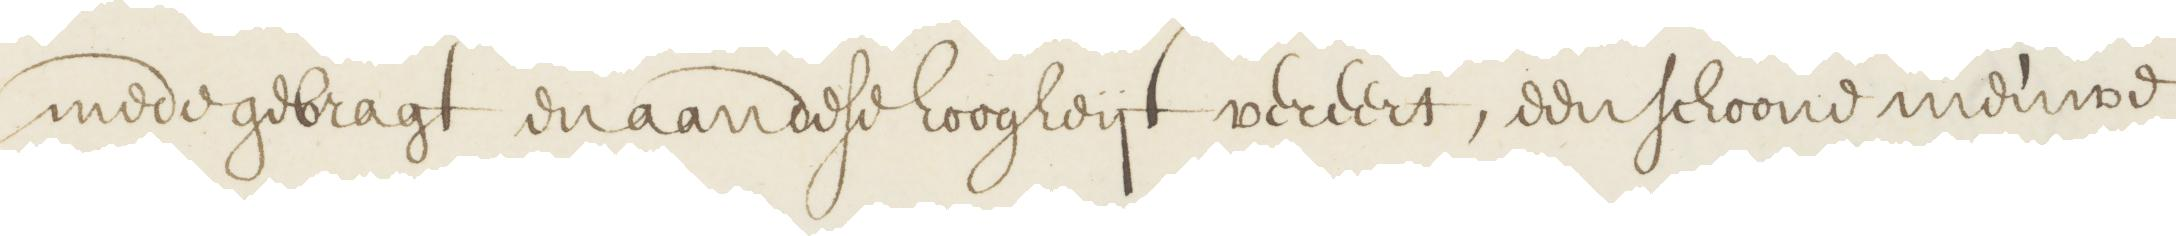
mede gebragt en aan dese hoogheijt vereert, een schoone nieuwe
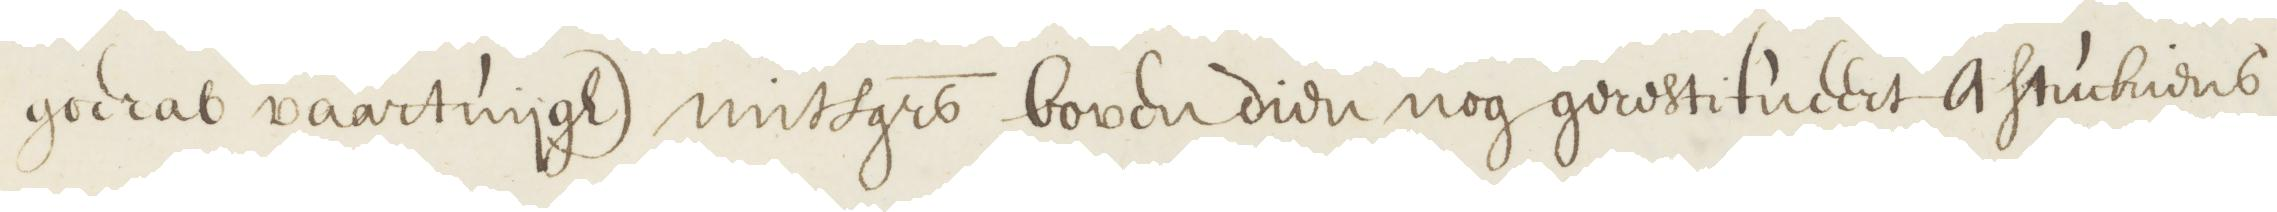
goerab vaartuijgh) mitsgrs boven dien nog gerestitueert 4 stuckiens
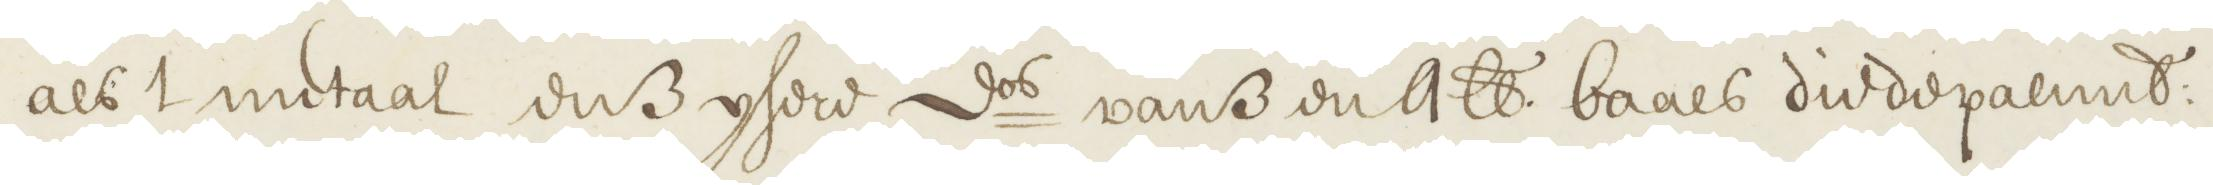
als 1 metaal en 3 ysere d=os van 3 en 4 lb. baals die de palimb:
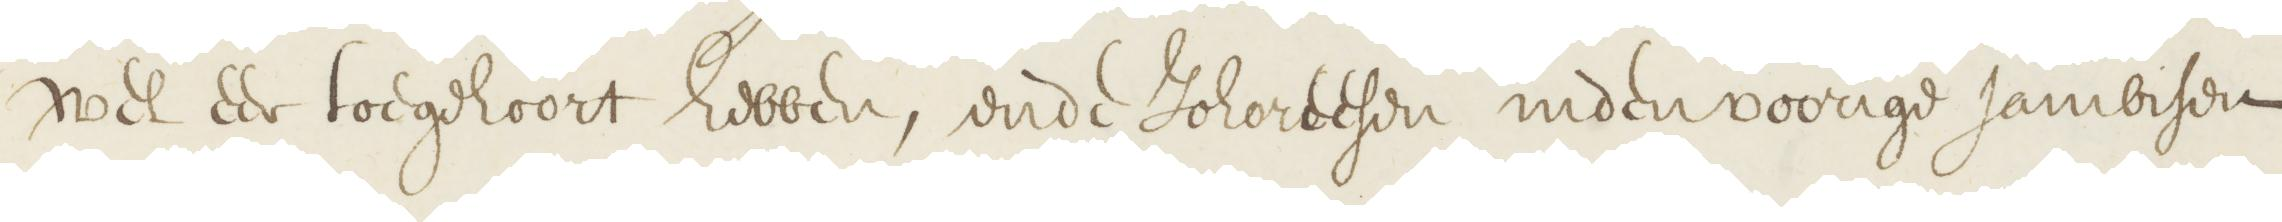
wel eer toegehoort hebben, ende Iohoreesen in den voorige Jambisen
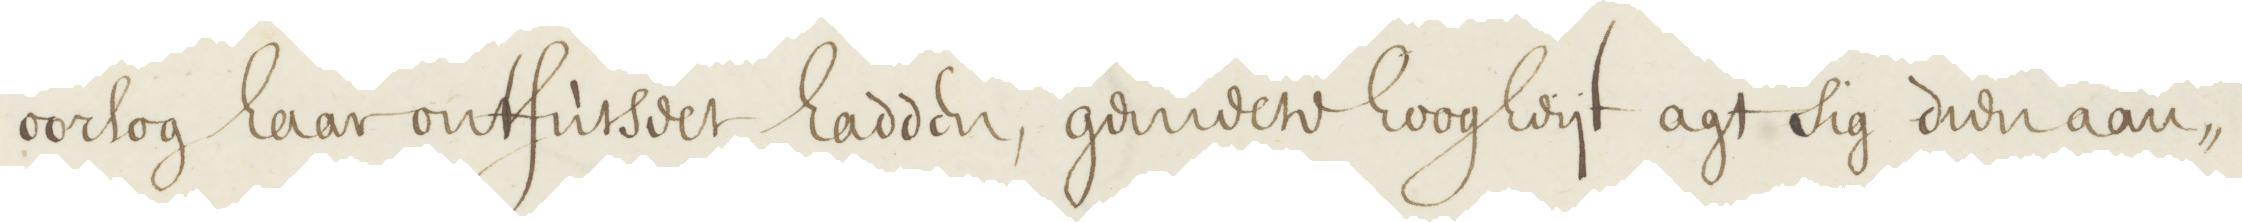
oorlog haar ontfutselt hadden, gemelte hoogheijt agt sig dien aan„
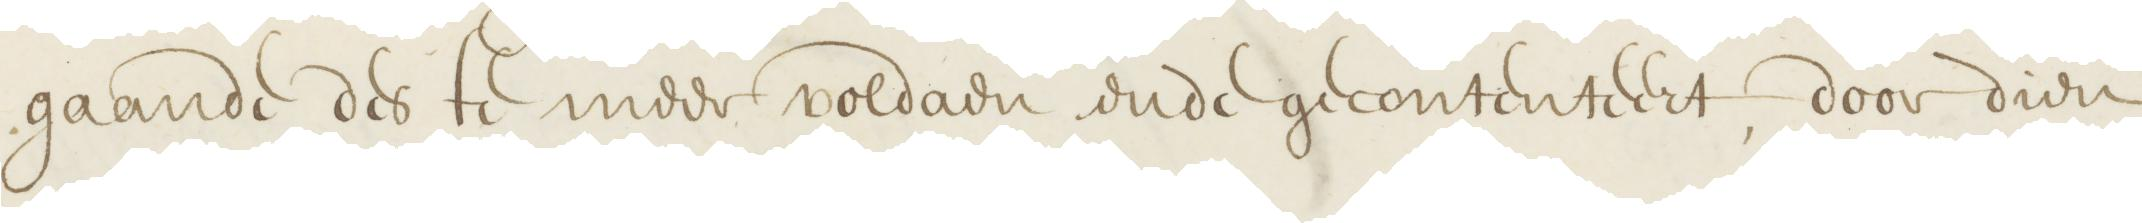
gaande des te meer voldaen ende gecontenteert, door dien
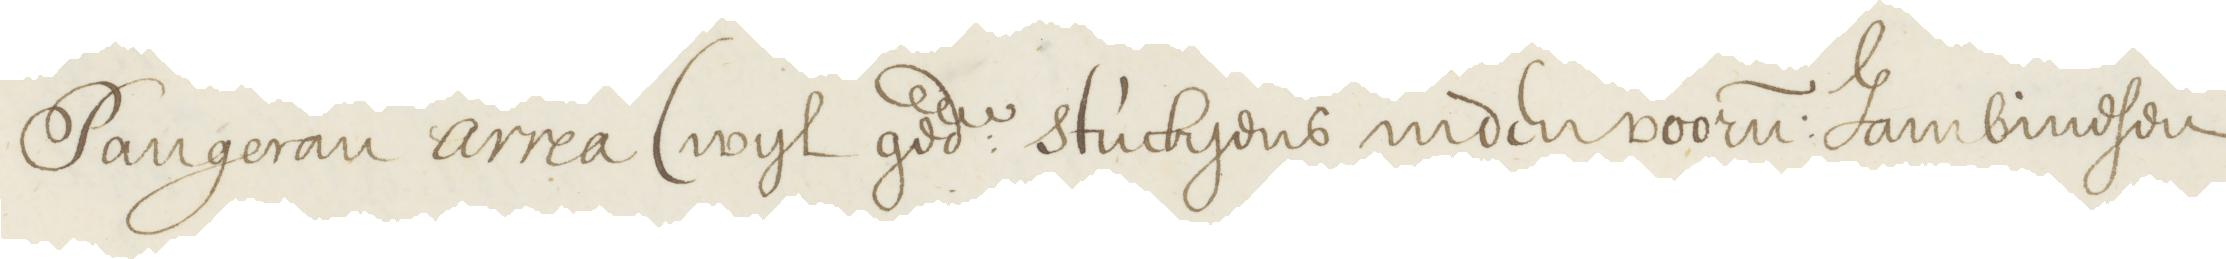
Pangeran arrea (wyl ged:e stuckjens in den voorn: Iambinesen
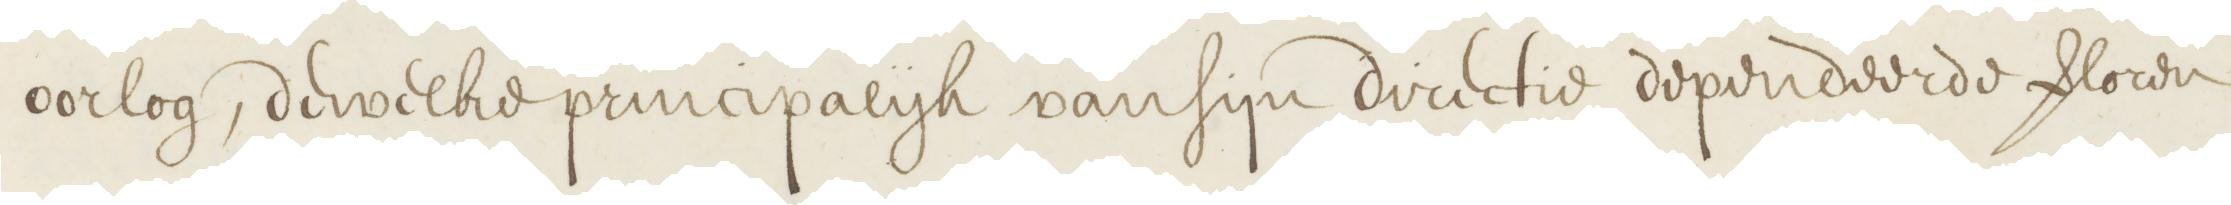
oorlog, dewelke principalijk van sijn directie dependeerde verloren
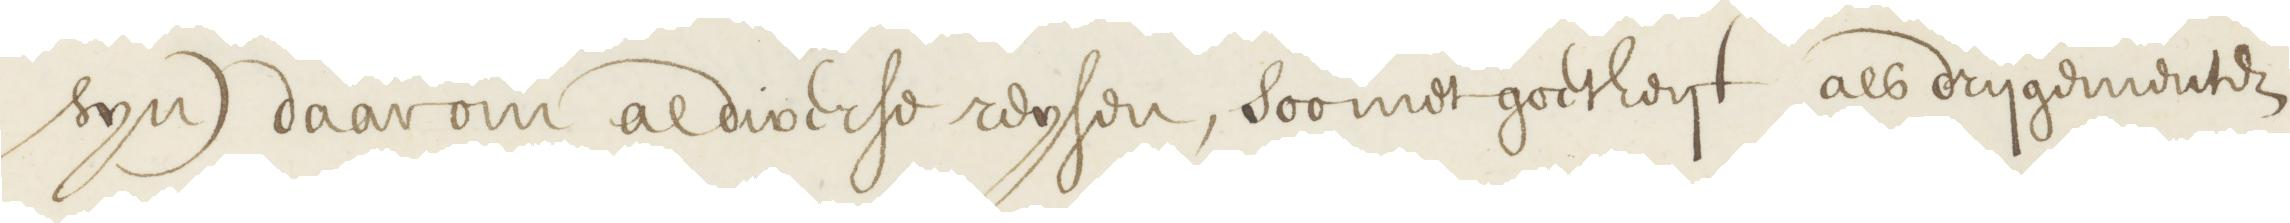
syn) daarom al diverse reysen, soo met goetheyt als drijgementen
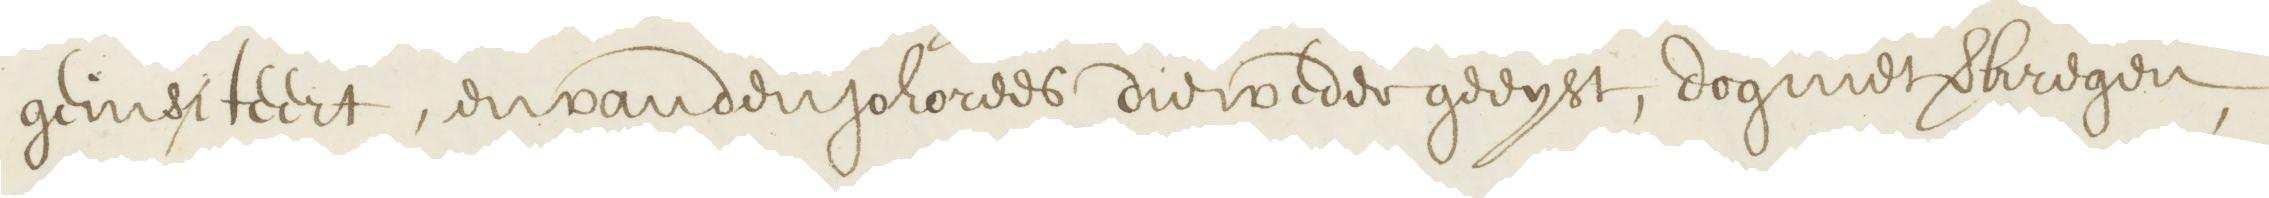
geinsiteert, en van den phorees die weder geeyst, dog niet verkregen,
